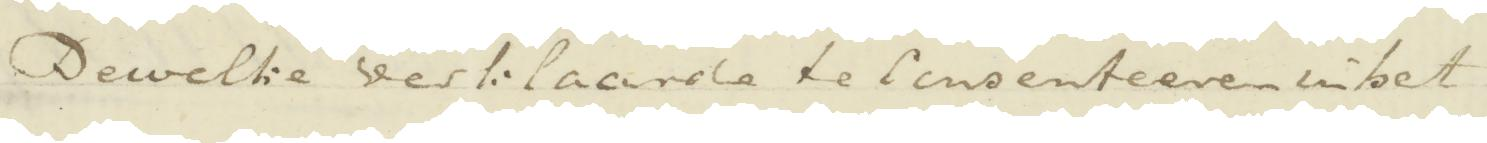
Dewelke verklaarde te consenteeren in het
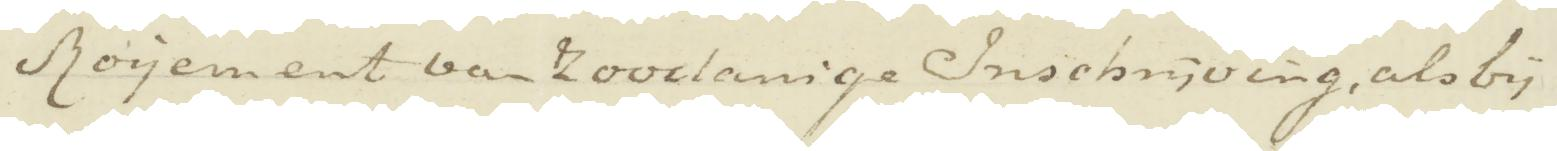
Roijement van Zoodanige Inschrijving, als bij
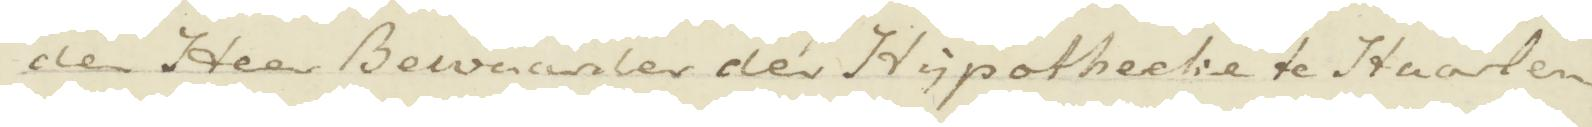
den Heer Bewaarder der Hijpotheeke te Haarlem
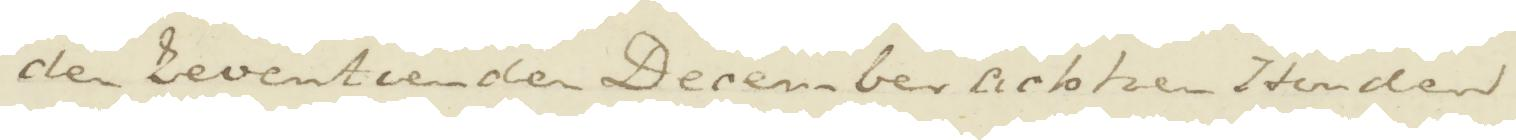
den Zeventienden December achtien Honderd
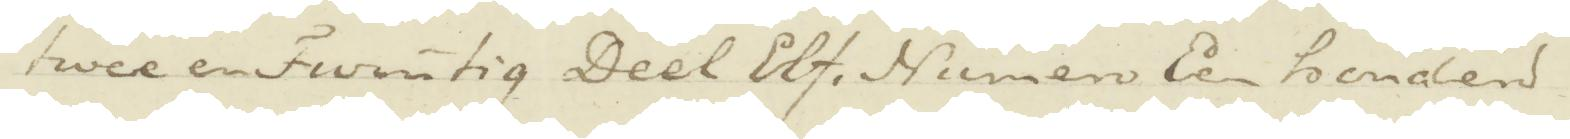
twee en Twintig Deel Elf, Numero Een honderd
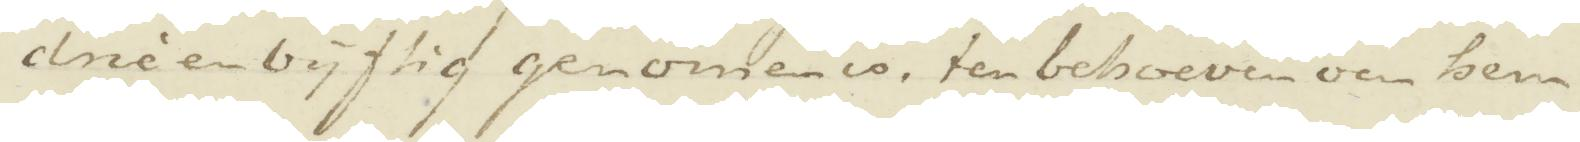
drie en vijftig genomen is, ten behoeven van hem
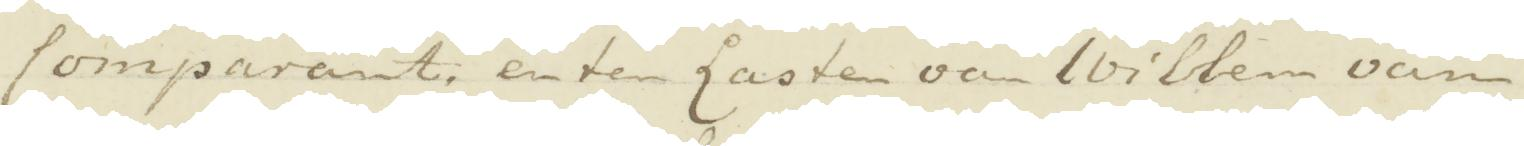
Comparant, en ten Lasten van Willem van
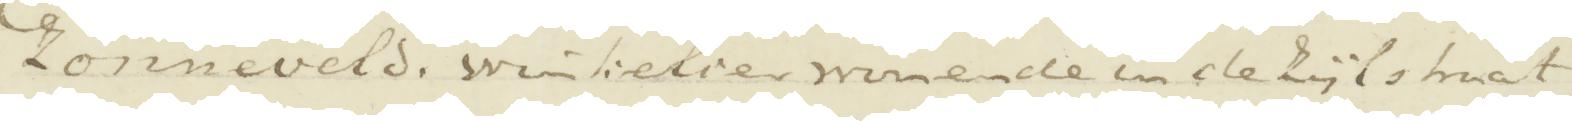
Zonneveld, winkelier wonende in de Zijlstaat
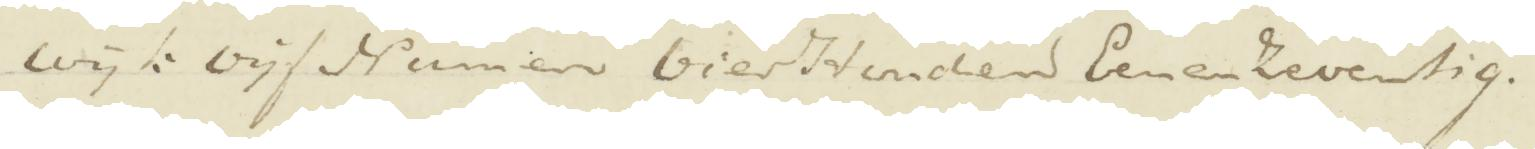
wijk vijf Numero Vier Honderd Een en zeventig.
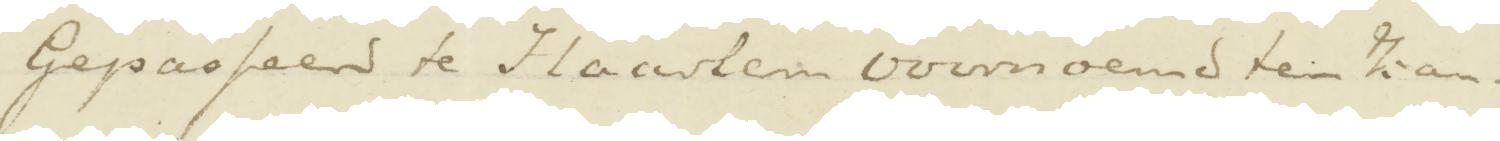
Gepasseerd te Haarlem voornoemd ten Kan.
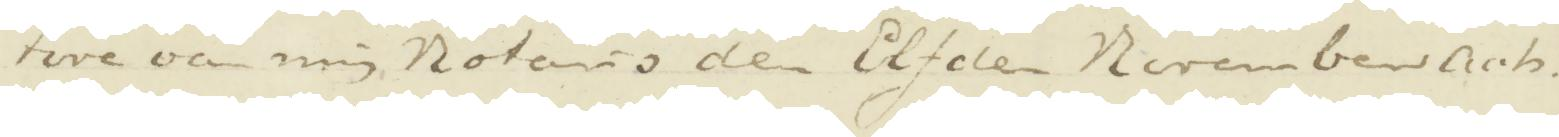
tore van mij Notaris den Elfden November Ach.
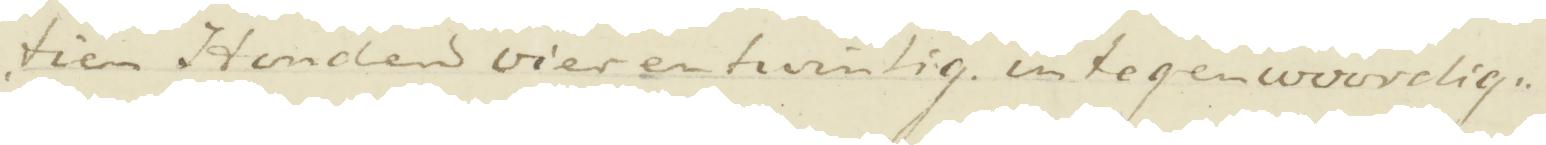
„tien Honderd vier en twintig, in tegenwoordig.
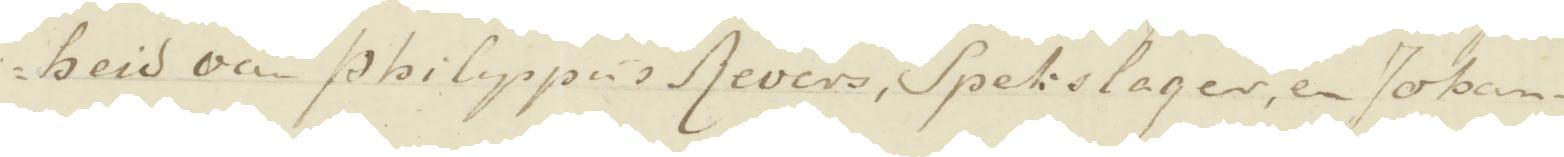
=heid van Philippus Revers, Spekslager, en Johan-
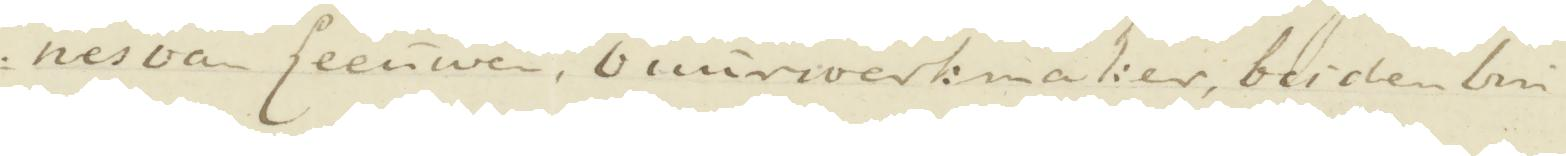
-nes van Leeuwen, vuurwerkmaker, beiden bin
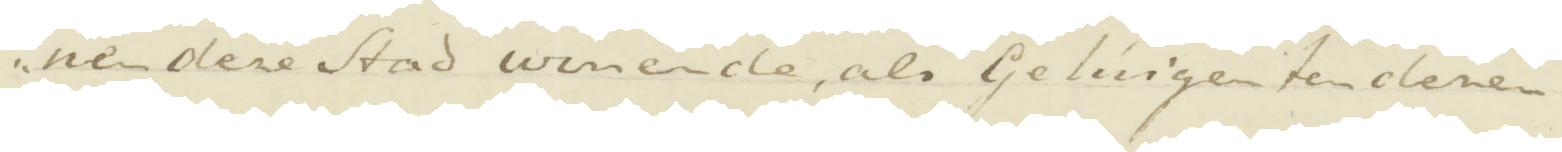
„nen deze stad wonende, als Getuigen ten dezen
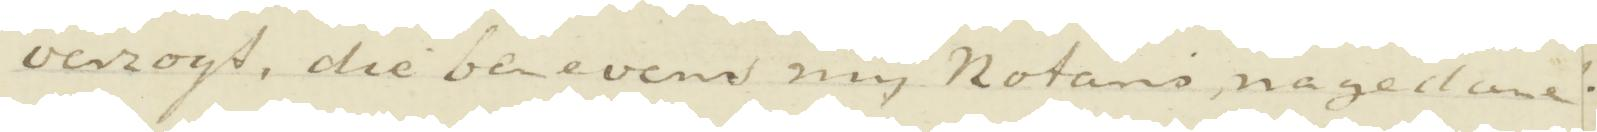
verzogt, die benevens my Notaris, na gedane
